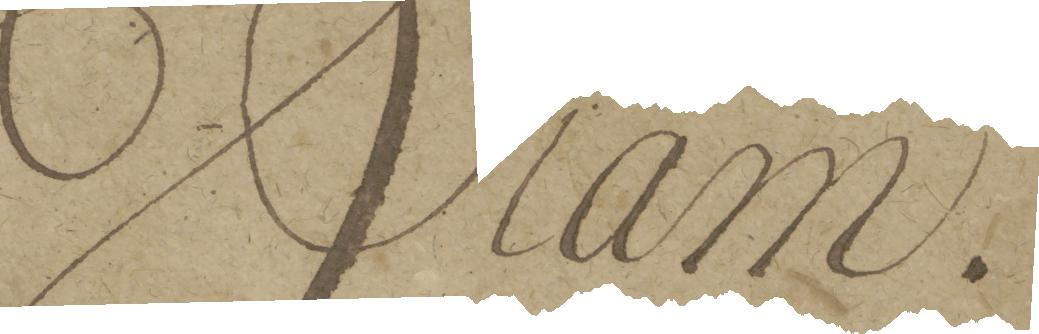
Siam.
